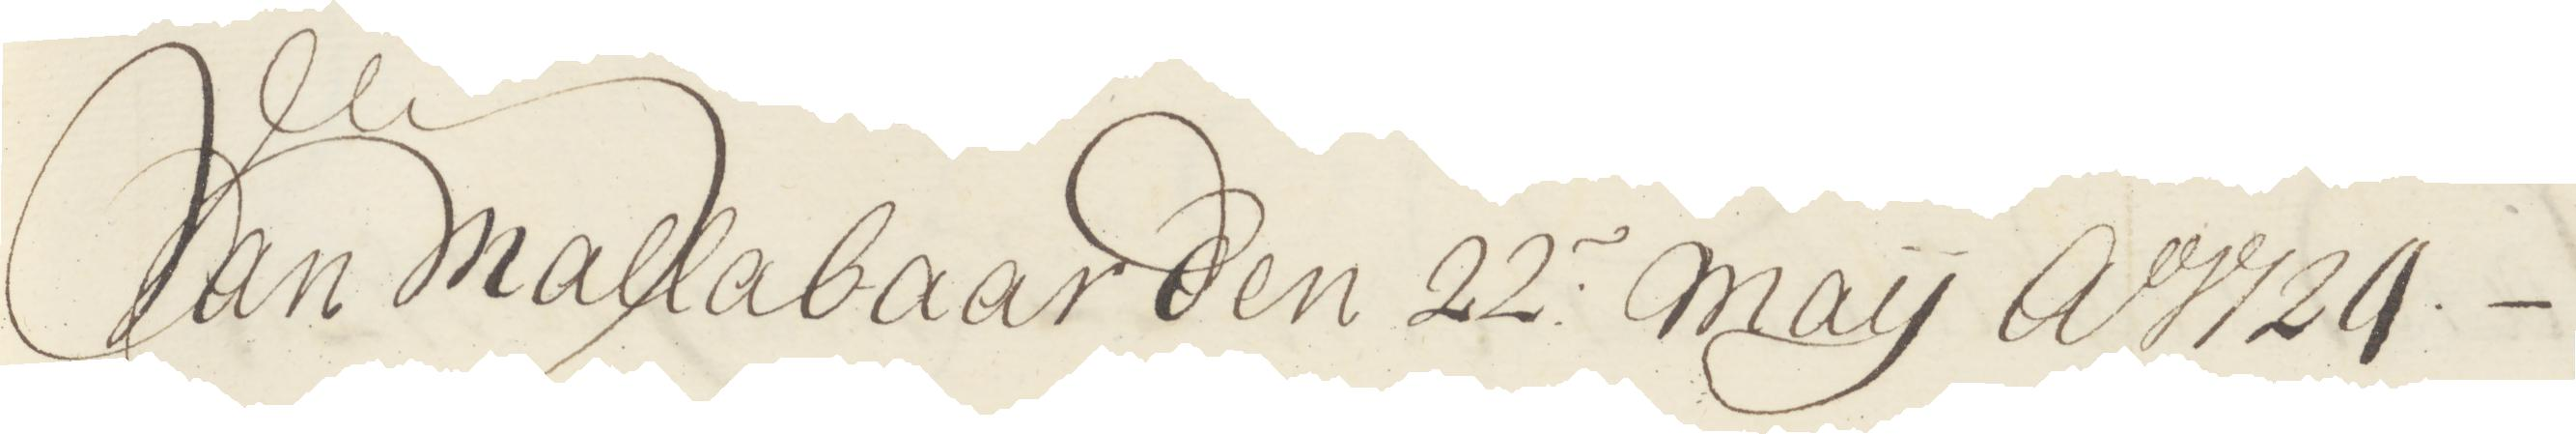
Van Mallabaar den 22:' Maij A:o 1724: –
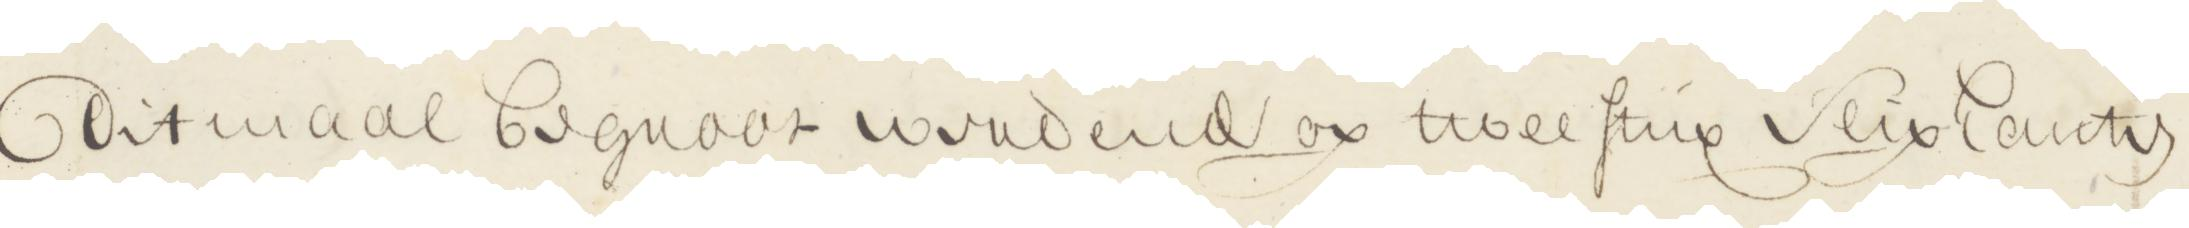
ditmaal begroot werdende op twee stux Eliphanten
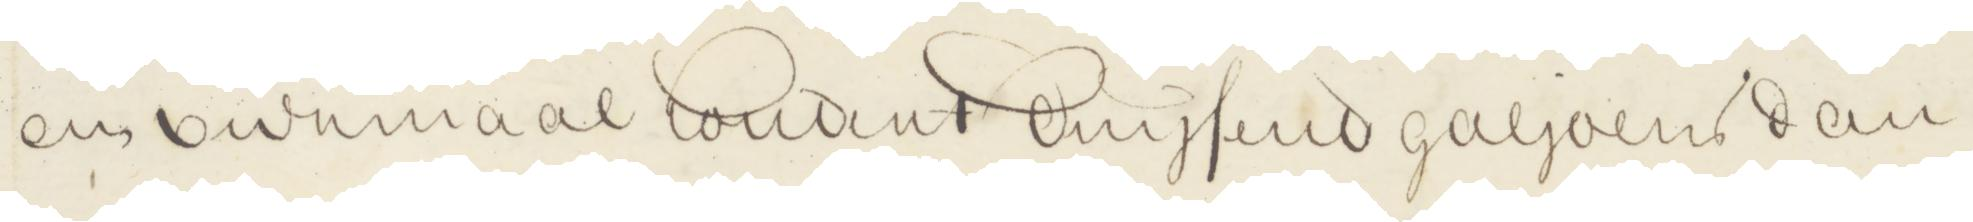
en viermaal hondert duysend galjoens dan
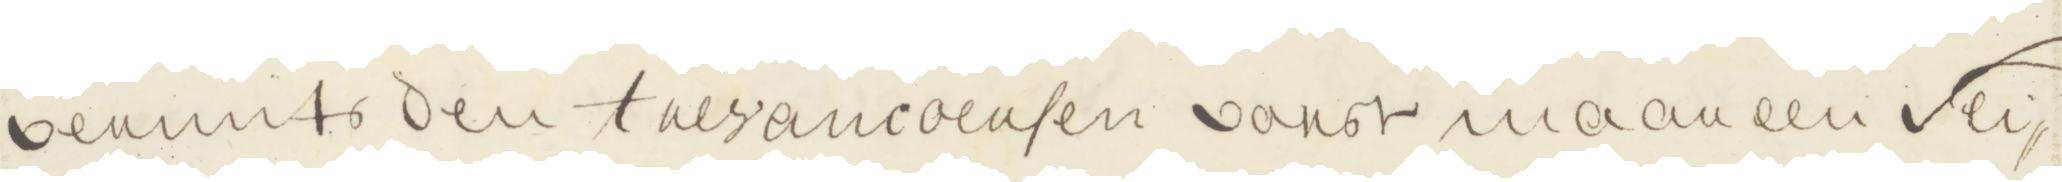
vermits den trevancoersen vorst maar een Eli„
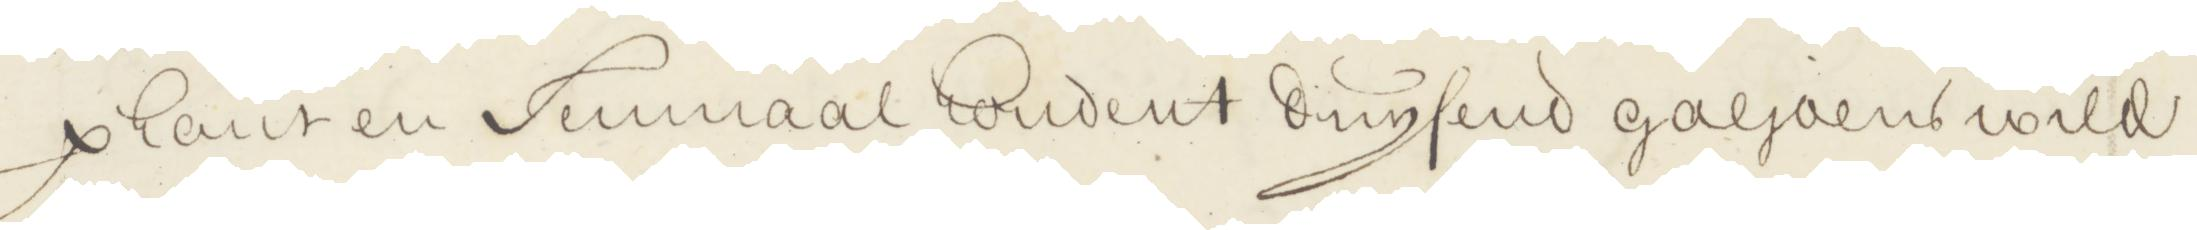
phant en Eenmaal hondert duysend galjoens wilde
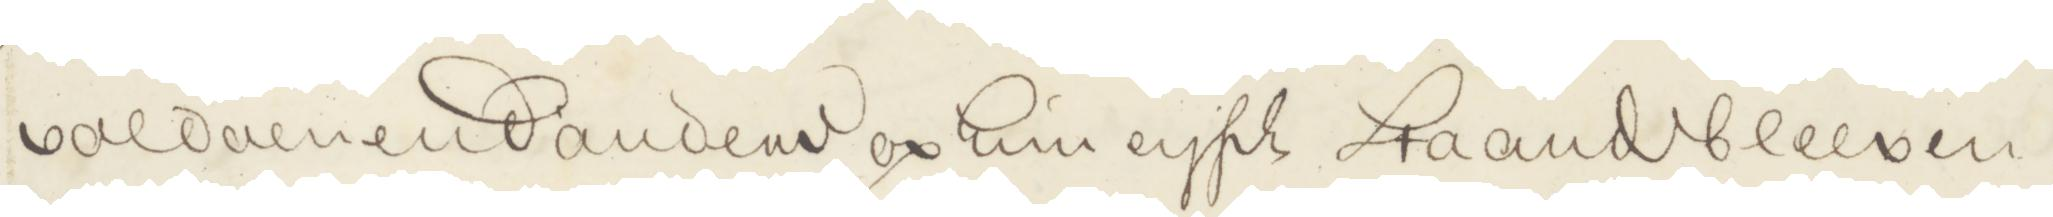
voldoen en d'andere op hun eijsch staande bleeven
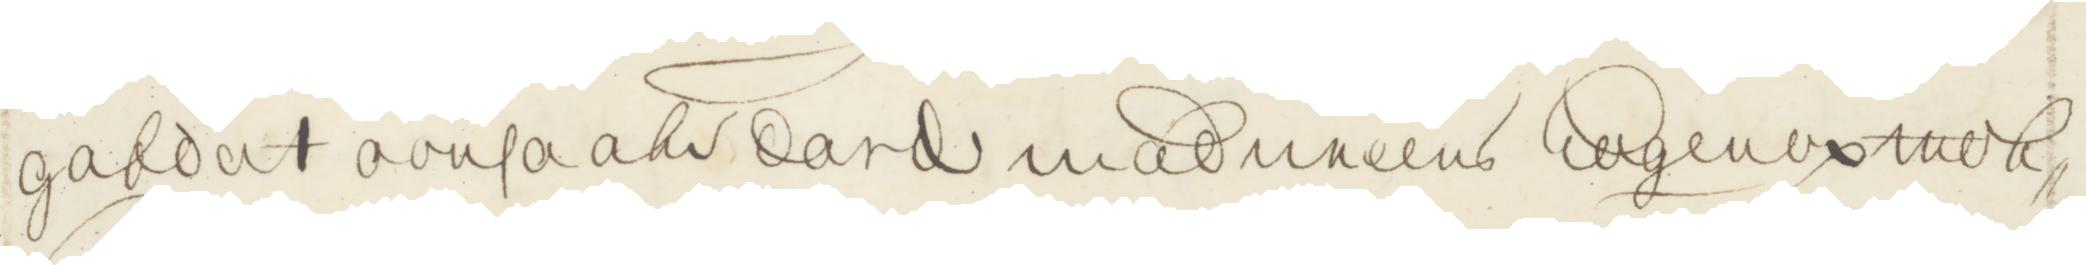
gaf dat oorsaake dat de madureers hoger optrek„
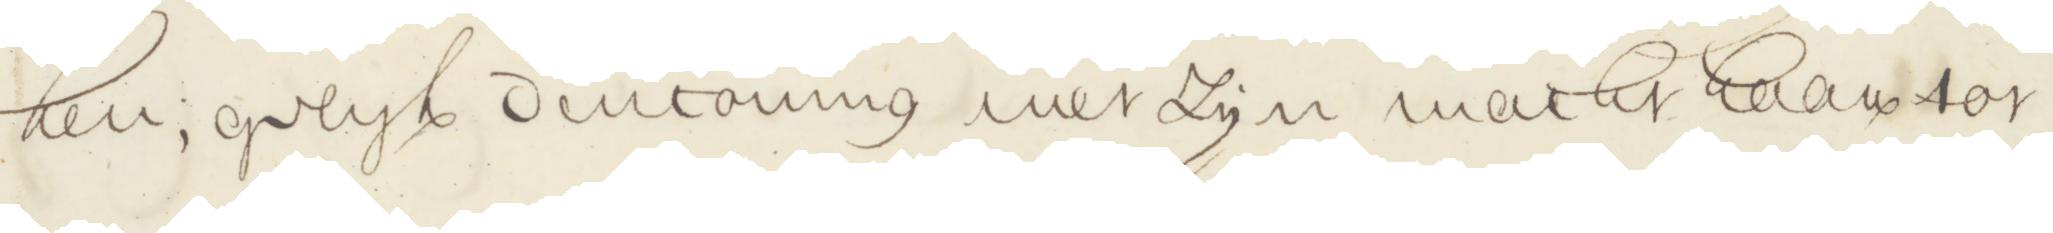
ken; gelijk den coning met zijn macht haar tot
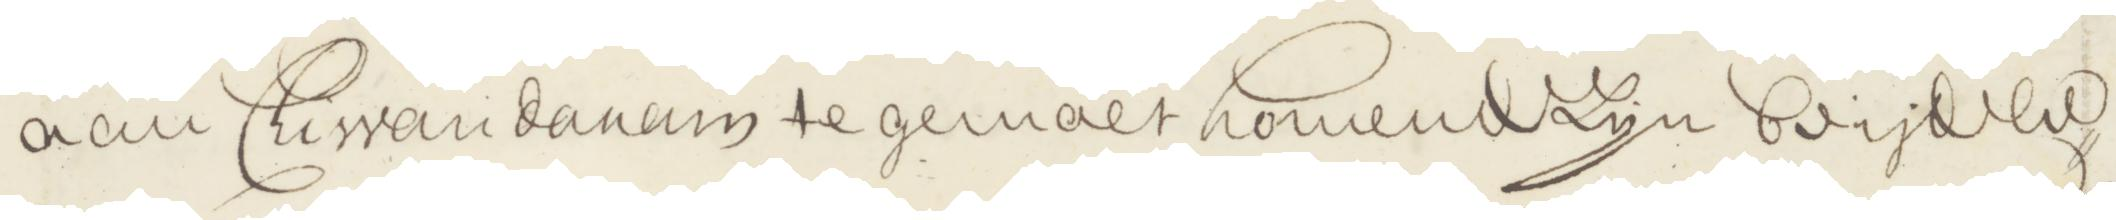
aan Chiwandaram te gemoet komende zijn beijde le„
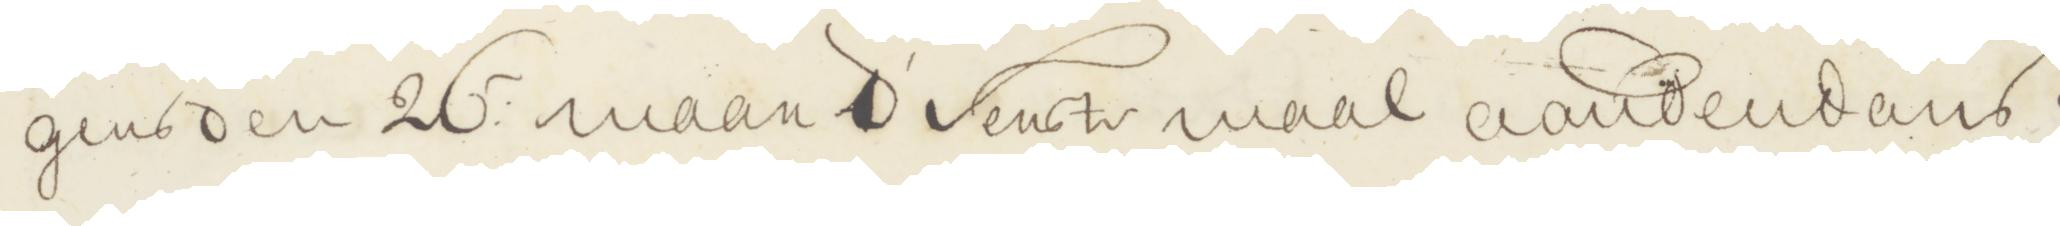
gers den 26:' maar d’Eerste maal aan den dans
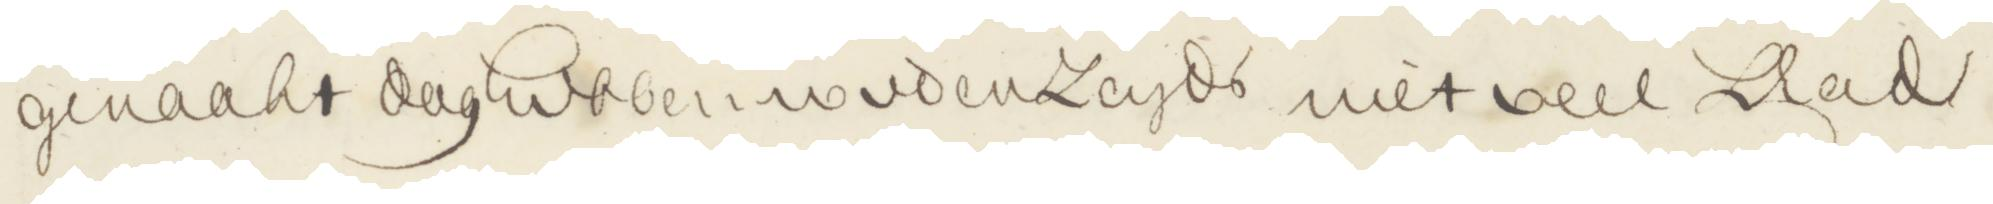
geraakt dog hebben wederzeijds niet veel schade
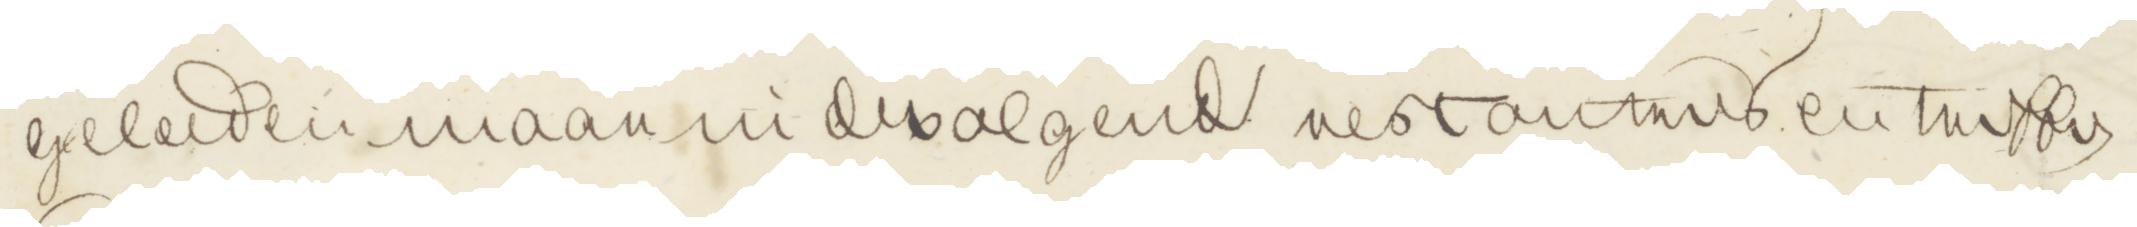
geleeden maar in de volgende rescontres en treffen
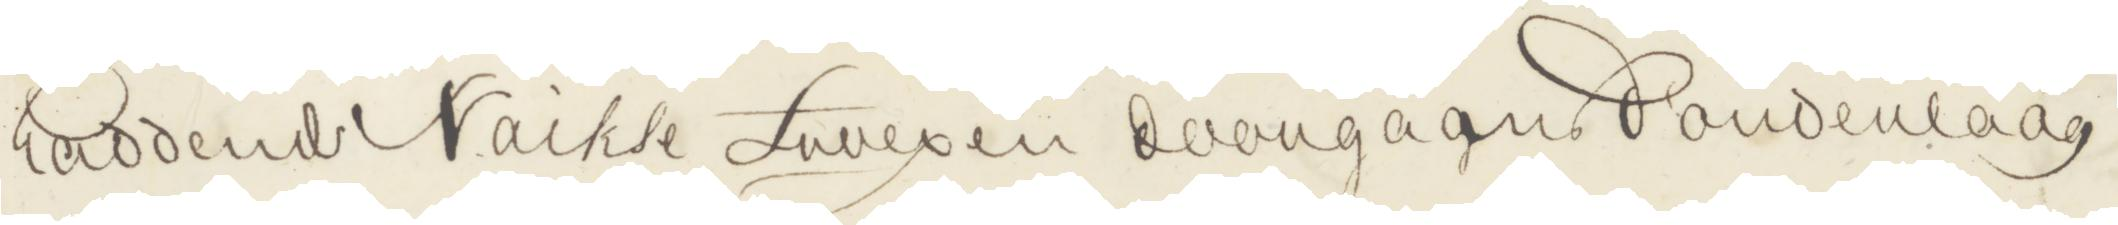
hadden de Naikse troepen doorgaans d'onderlaag
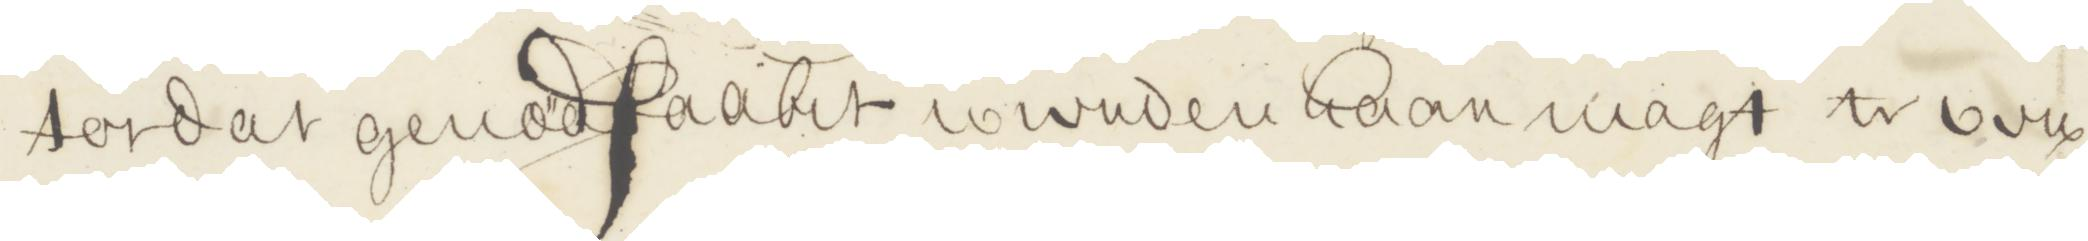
tot dat genodsaakt wierden haar magt te ver
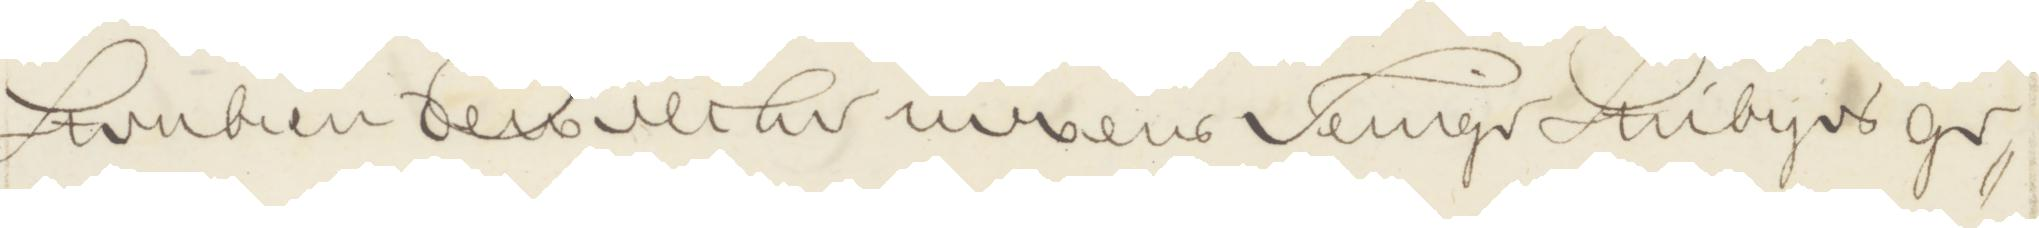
sterken dewelcke nevens Eenige stukjes ge„
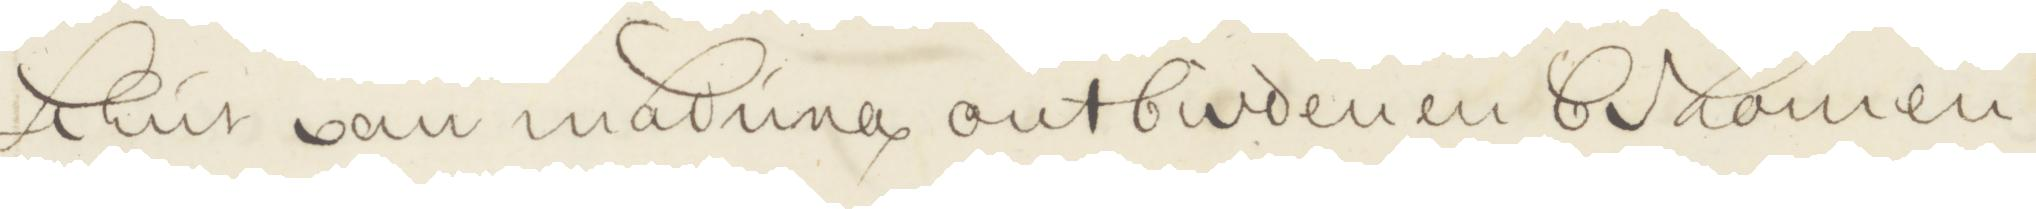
schut van madura ontbieden en bekomen
